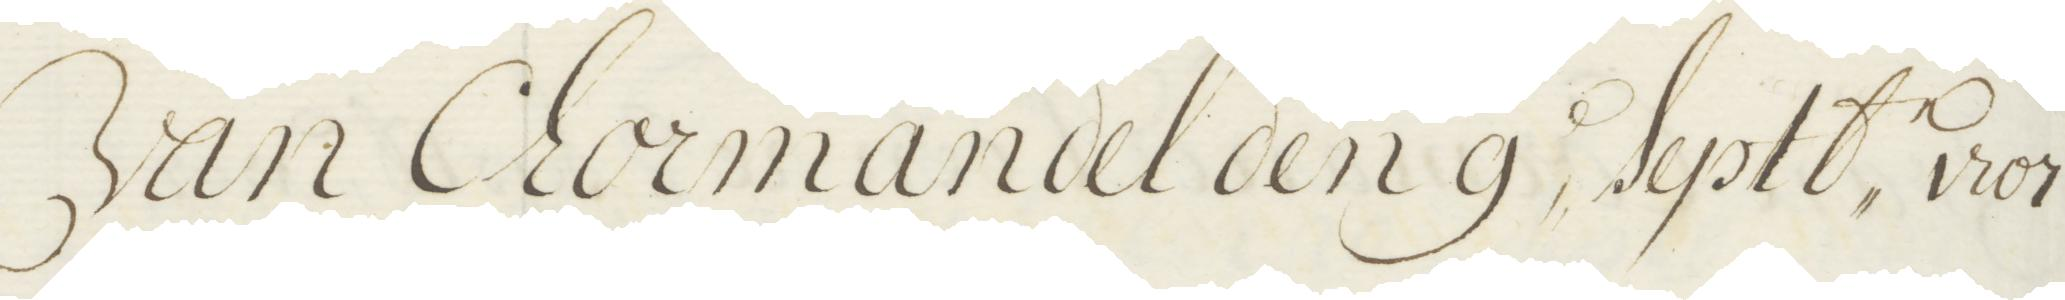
Van Chormandel den 9„e Septb„r 1707
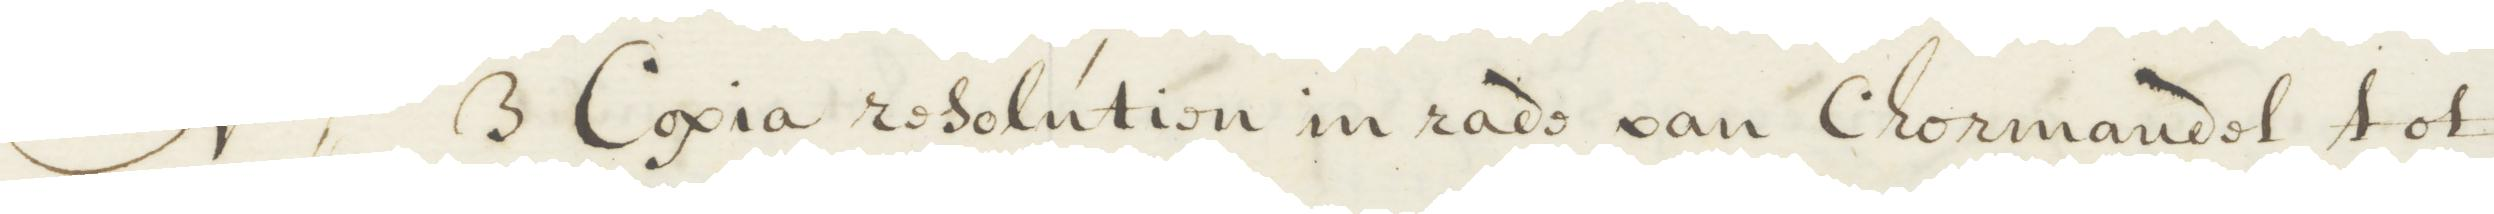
N„o 3 Copia resolutien in rade van Chormandel tot
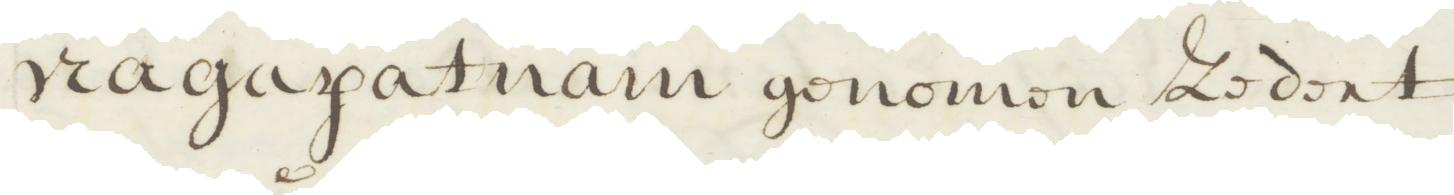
nagapatnam genomen, Zedert
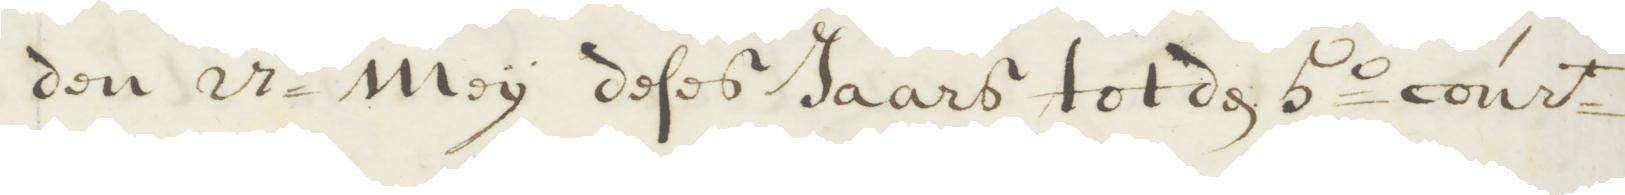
den 27=e meij deses Iaars tot den 5=o cour=t
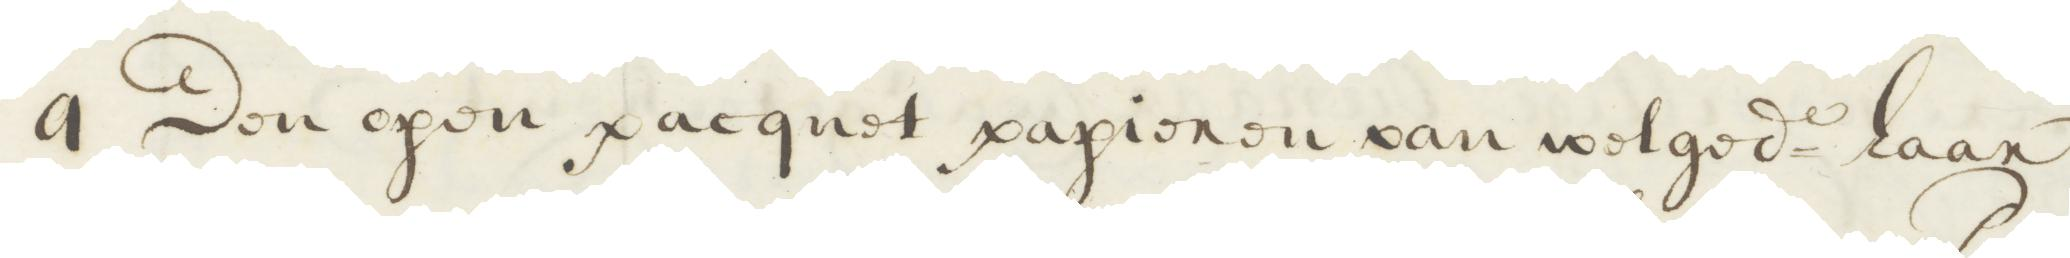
4 Den open pacquet papieren van wel ged=e haar
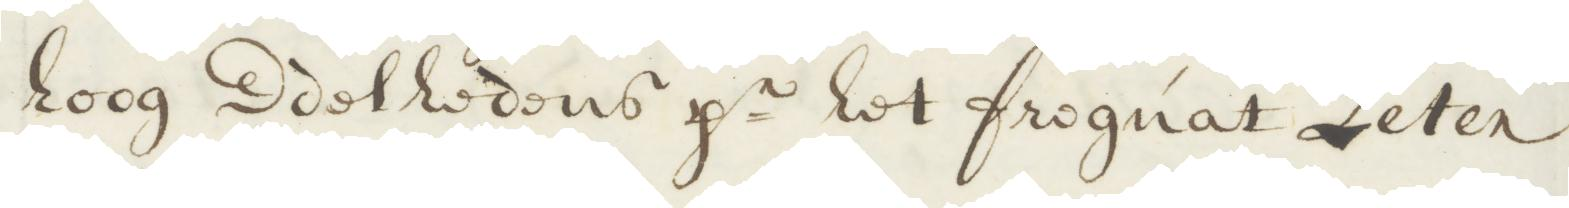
hoog Edelhedens p=r het freguat Peter
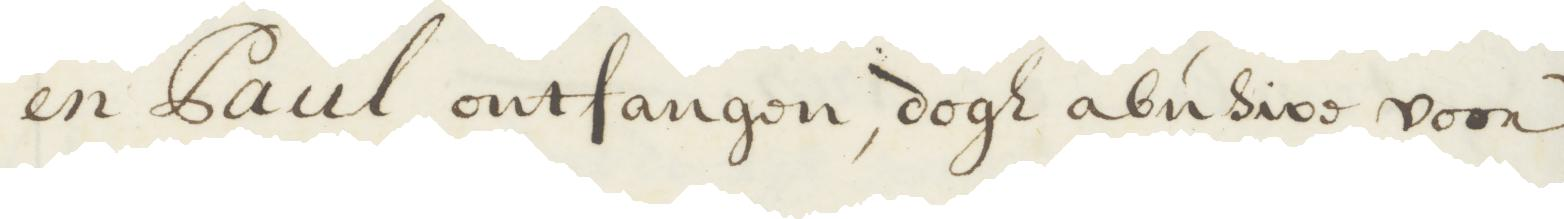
en Paul, ontfangen, dogh abusive voor
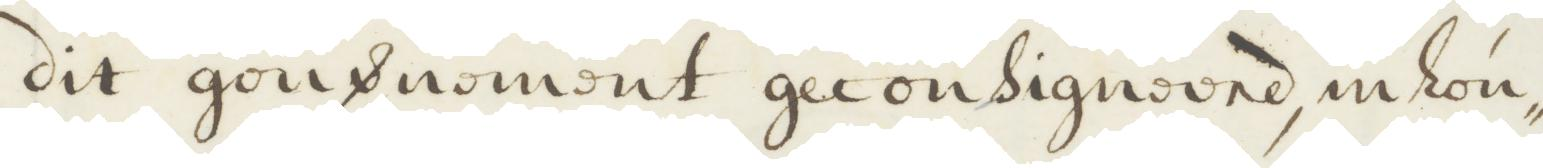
dit gouvernement geconsigneerd, inhou
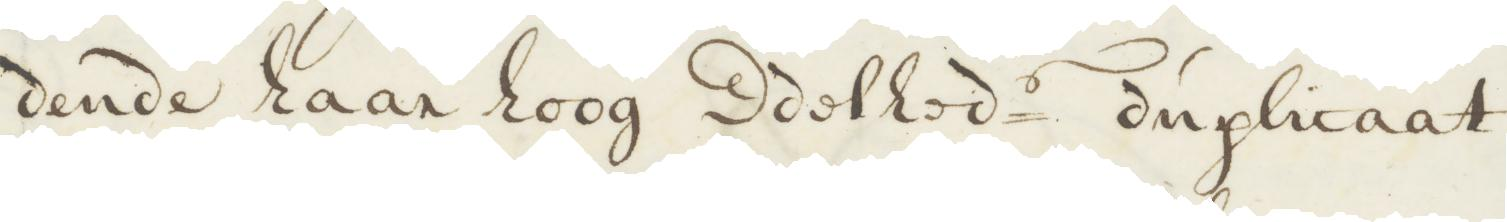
dende haar hoog Edelhed=s duplicaat
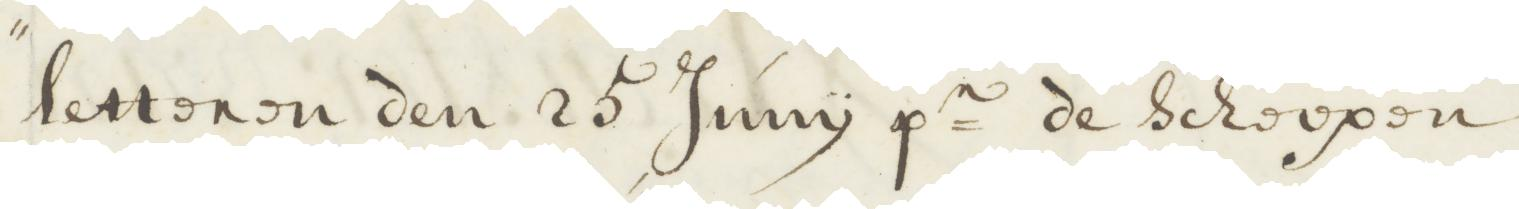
letteren den 25 Junij p=r de scheepen
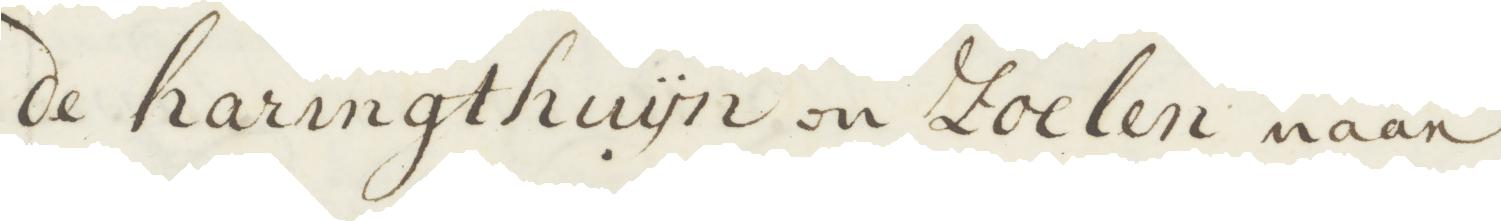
de haringthuijn en Zoelen naar
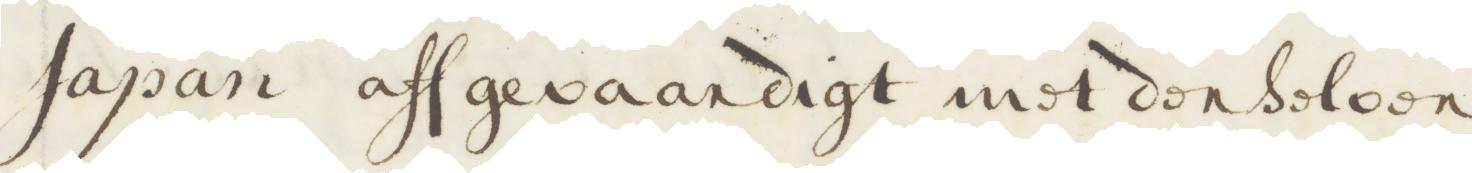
Japan affgevaardigt met derselver
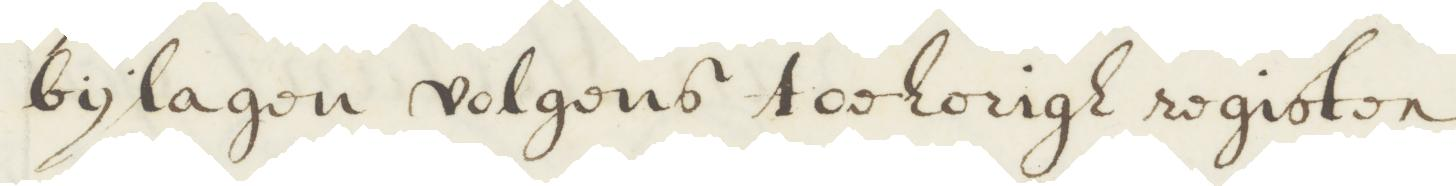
bijlagen volgens toehorigh register
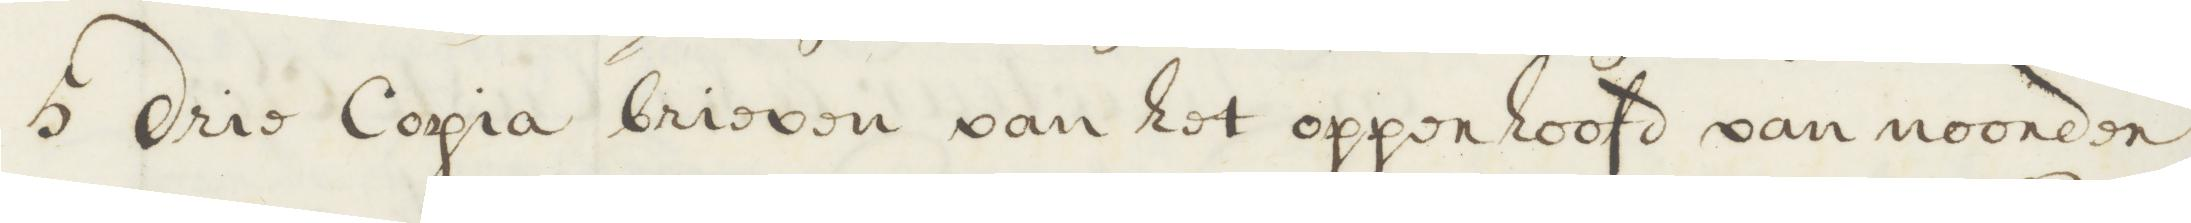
5 drie Copia brieven van het opperhoofd van noorder
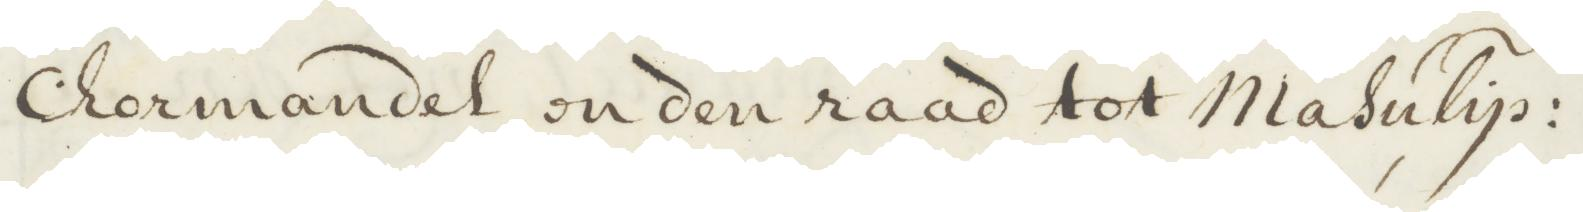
Chormandel, en den raad tot Masulip:
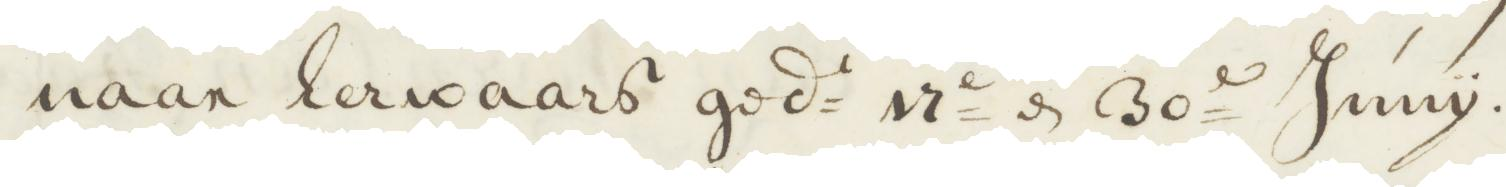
naar herwaars ged=t 17=e en 30=e Junij.
